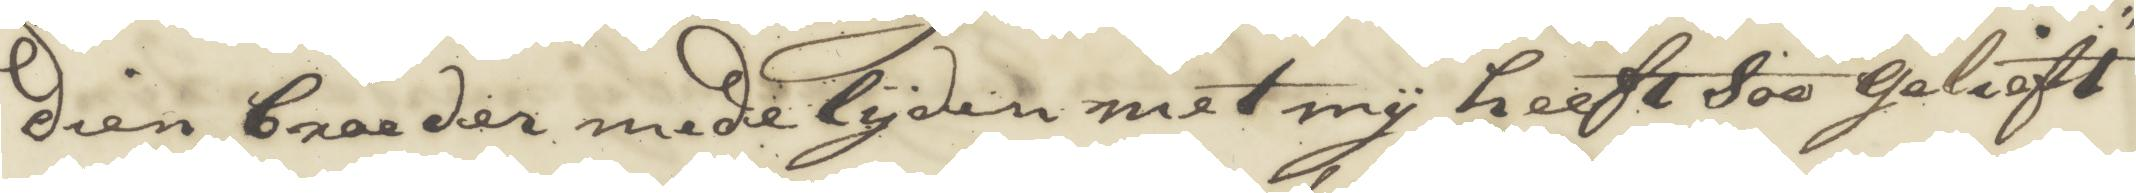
dien broeder medelijden met mij heeft soo gelieft
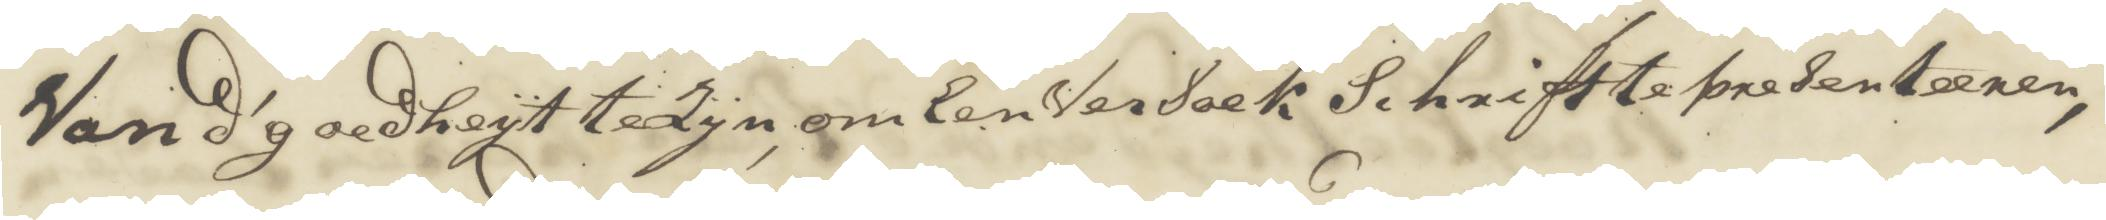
van d’goedheijt te zijn, om Een versoek schrift te presenteeren,
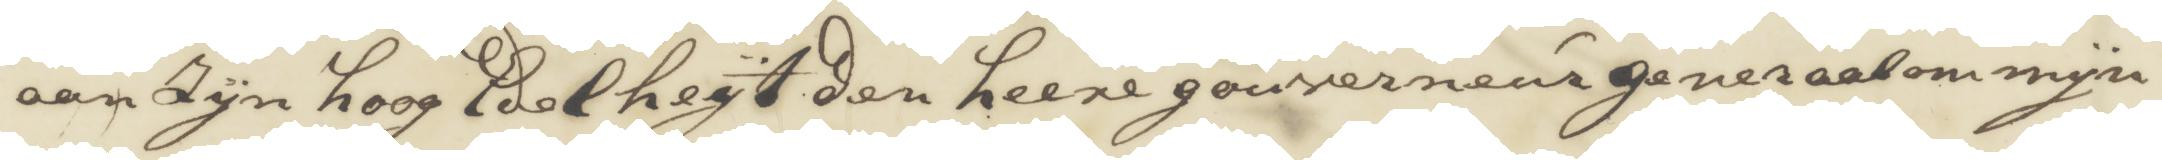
aan zijn hoog Edelheijt den heere gouverneur generaal om mijn
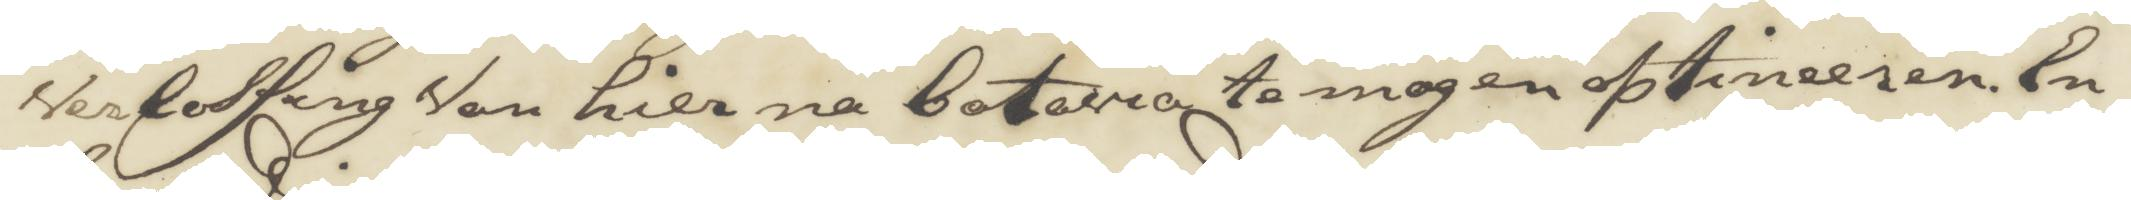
verlossing van hier na batavia te mogen optineeren. En
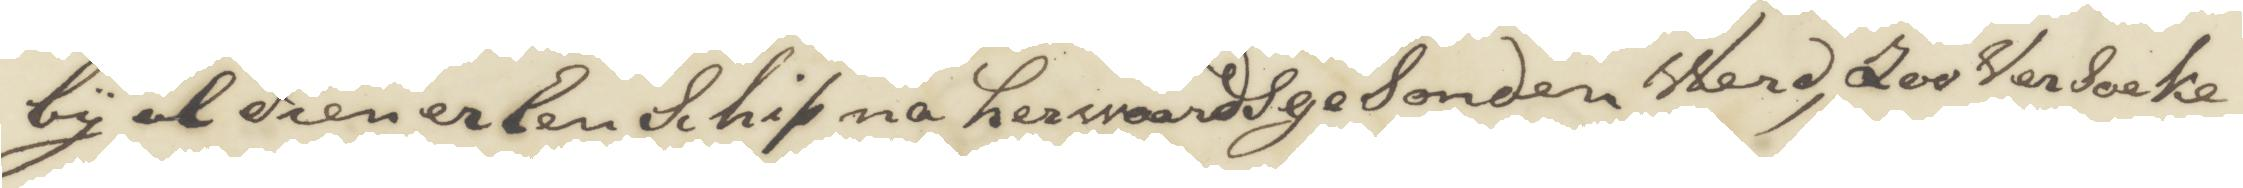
bij aldien er Een schip na herwaards gesonden werd, zoo versoeke
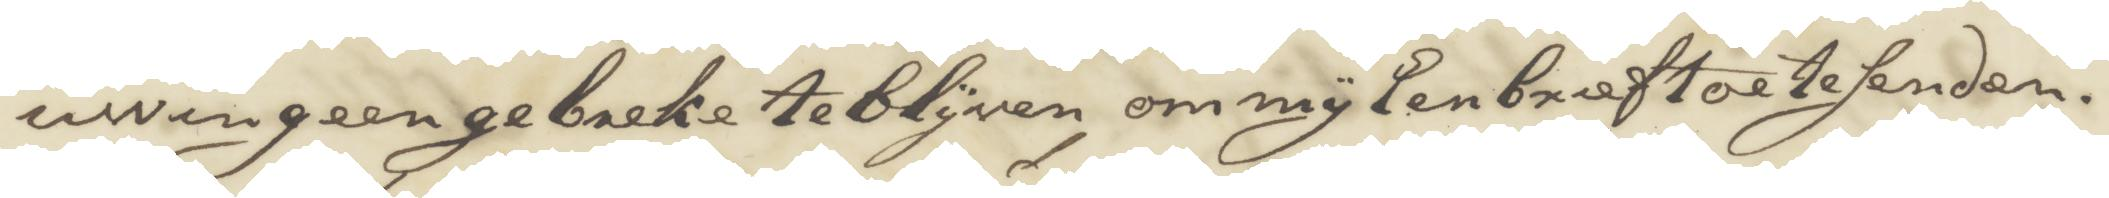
uw in geen gebreke te blijven, om mij Een brief toe te senden.
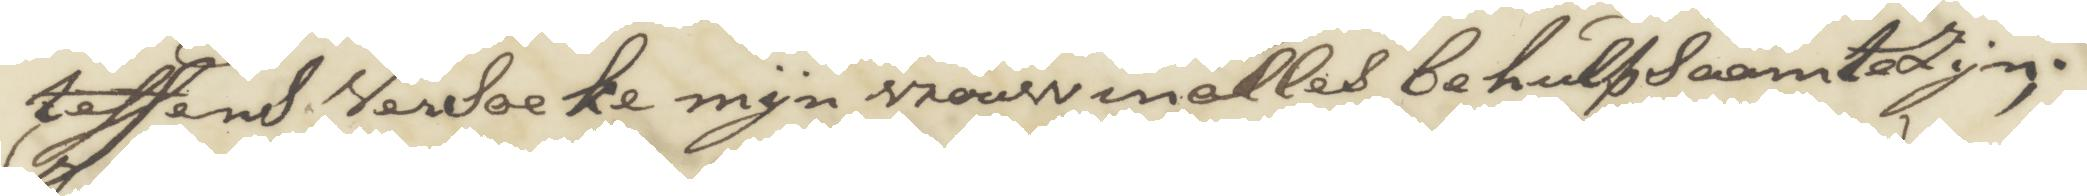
teffens versoeke mijn vrouw in alles behulpsaam te zijn;
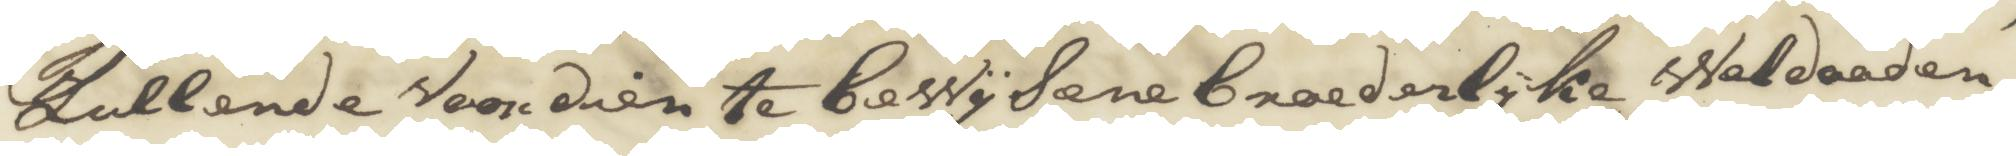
zullende voor dien te bewijsene broederlijke weldaaden
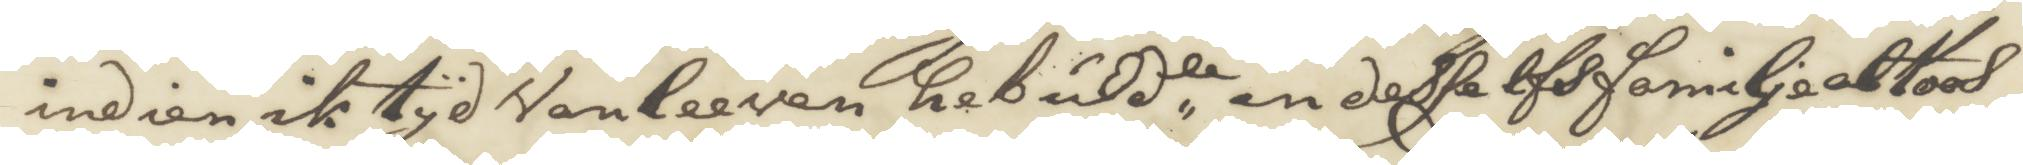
indien ik tijd van leeven heb uEd„le en deseselfs familje altoos
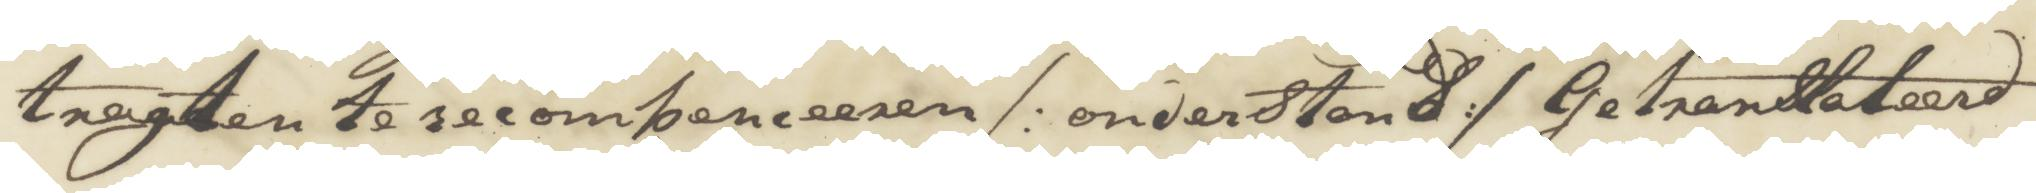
tragten te recompenceeren /: onderstend :/ Getranslateerd
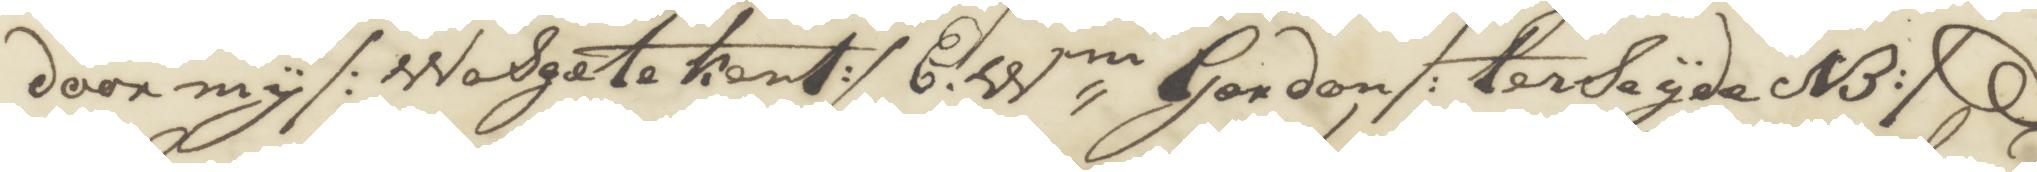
door mij /: was getekent:/ E: W„m Gorden /: terseijde NB:/
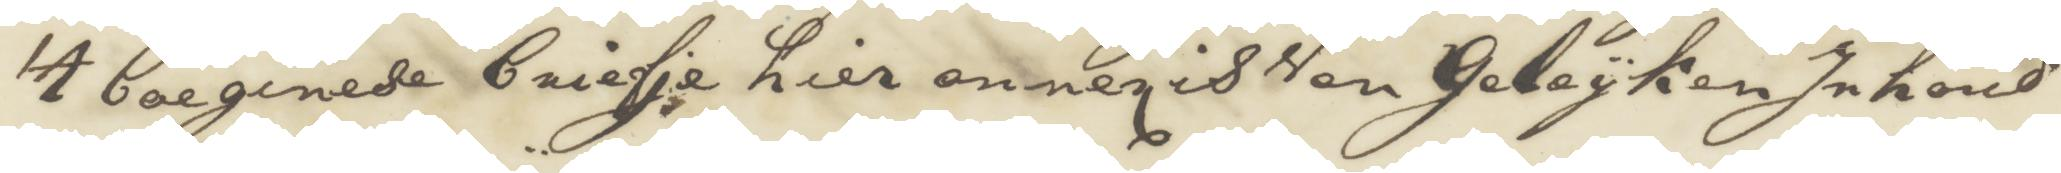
’t boeginese briefje hier annex is van geleijken Jnhoud
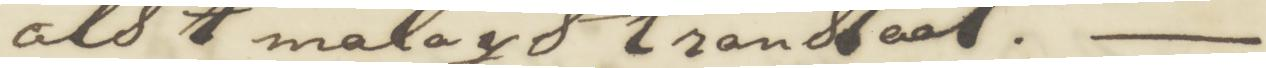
als ’t malaijs translaat. —
